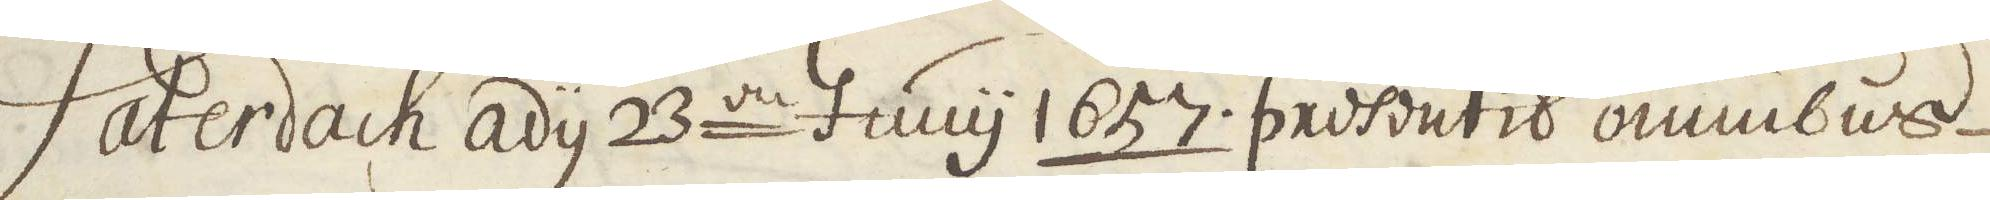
Saterdach adij 23=en Junij 1657. presentis omnibius-
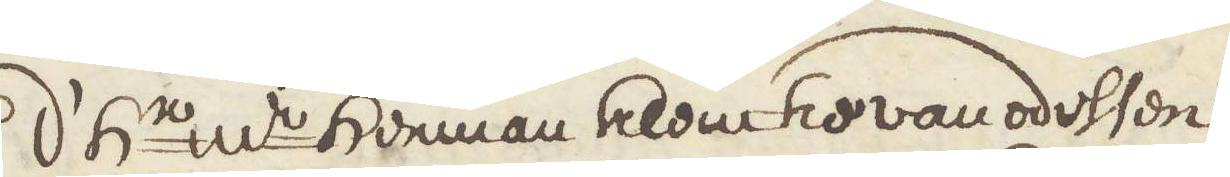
d’ h=r m=r herman klencke van odessen
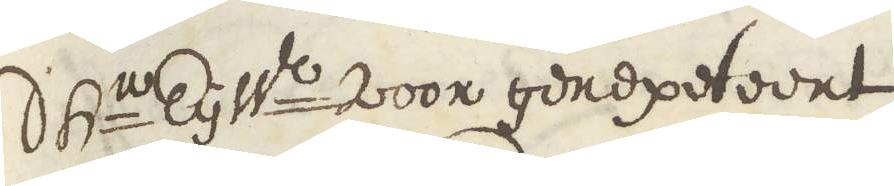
d' h=r Eijss=r voor gerepeteert
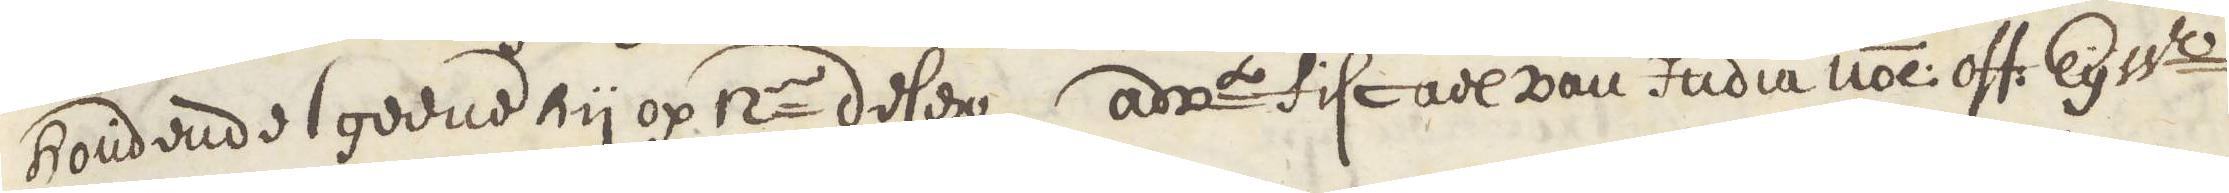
houdende t geene hij op 12=e deser adv=t fiscael van India noe: off: Eijss=r
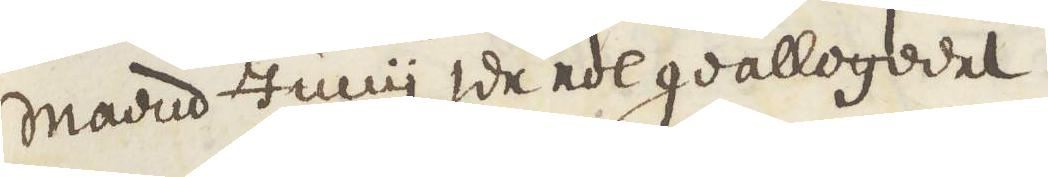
maend Iunij ter rol geallegeert
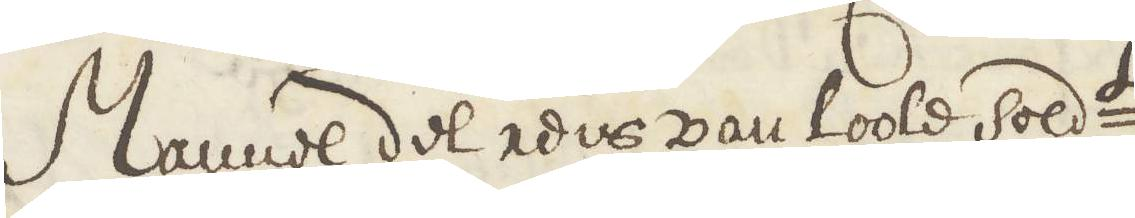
Manuel del reis van loole sold=t
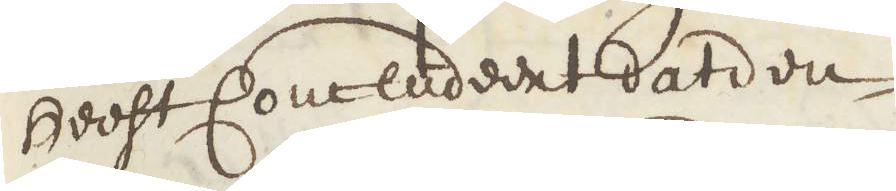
heeft Concludeert dat den
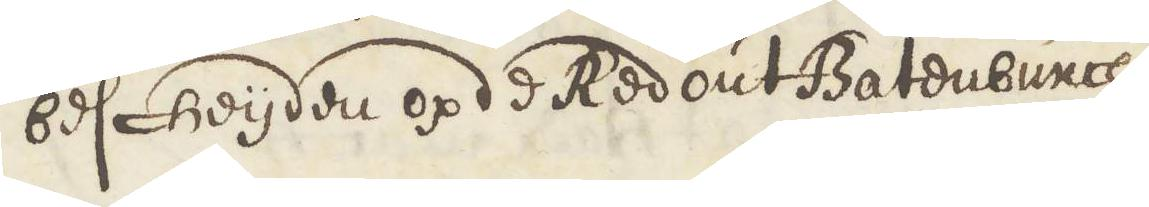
bescheijden op de Redout Batenburch
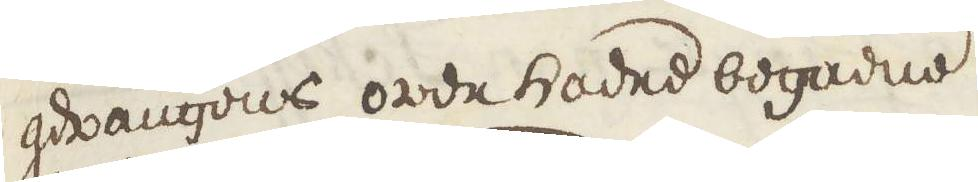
gevangens over haere begaene
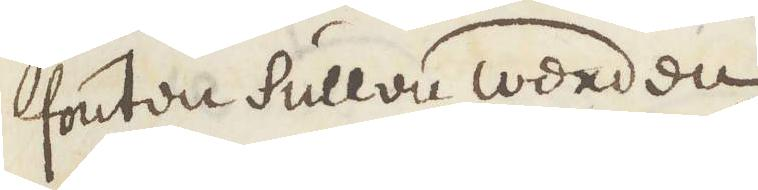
fouten sullen werden
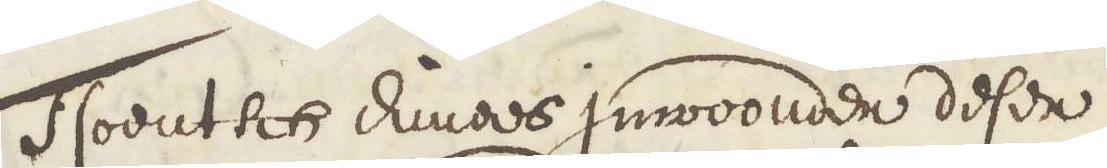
Tsoentsch chinees jnwoonder deser
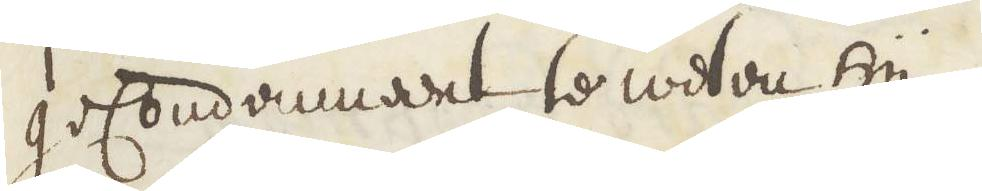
gecondemneert te weten hij
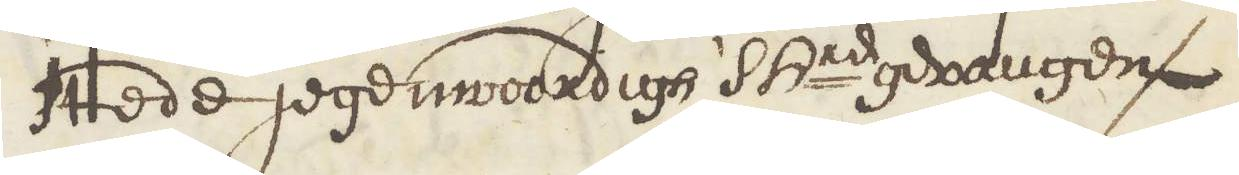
stede jegenwoordigh 's h=re gevangen/
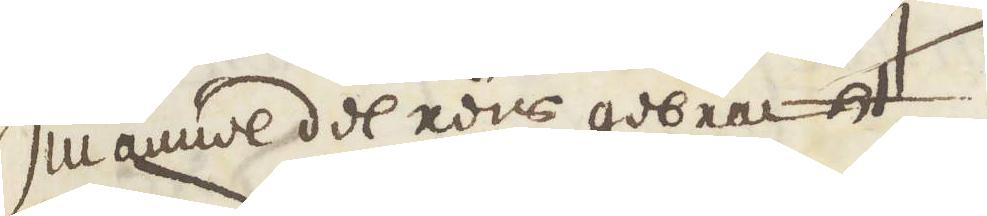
manuel del reis gebracht
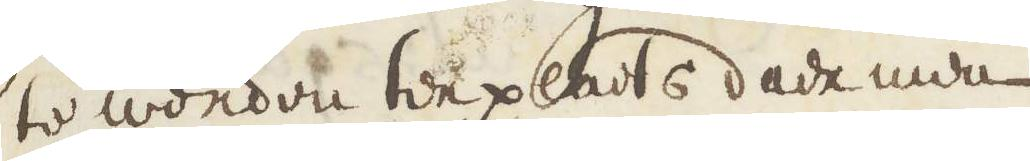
te werden ter plaets daer men
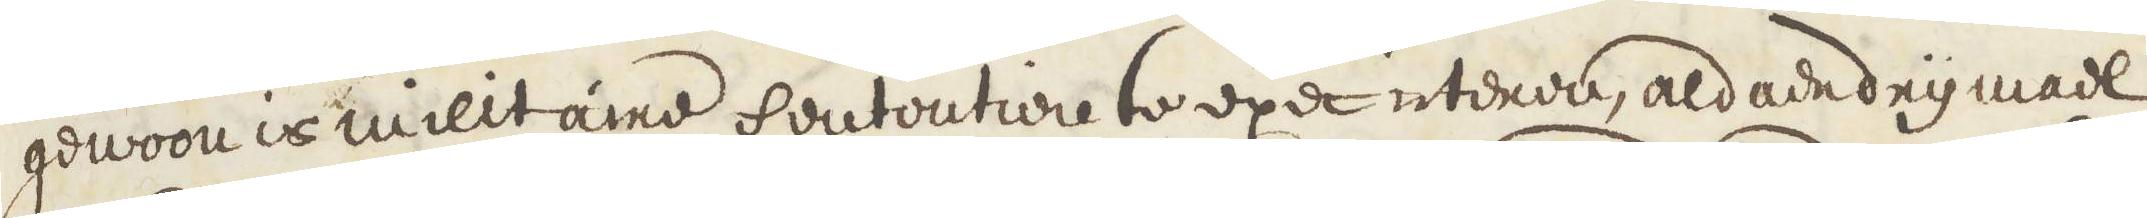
gewoon is militaire sententien te executeren, aldaer drij mael
